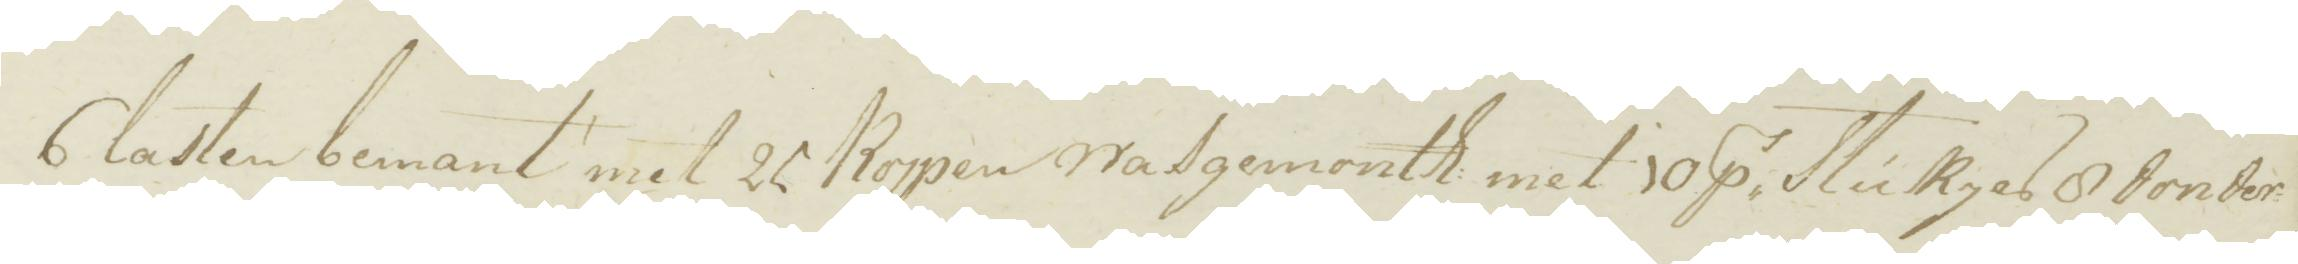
6 lasten bemant met 25 koppen was gemonth: met 10 p„s stukjes 8 donder=
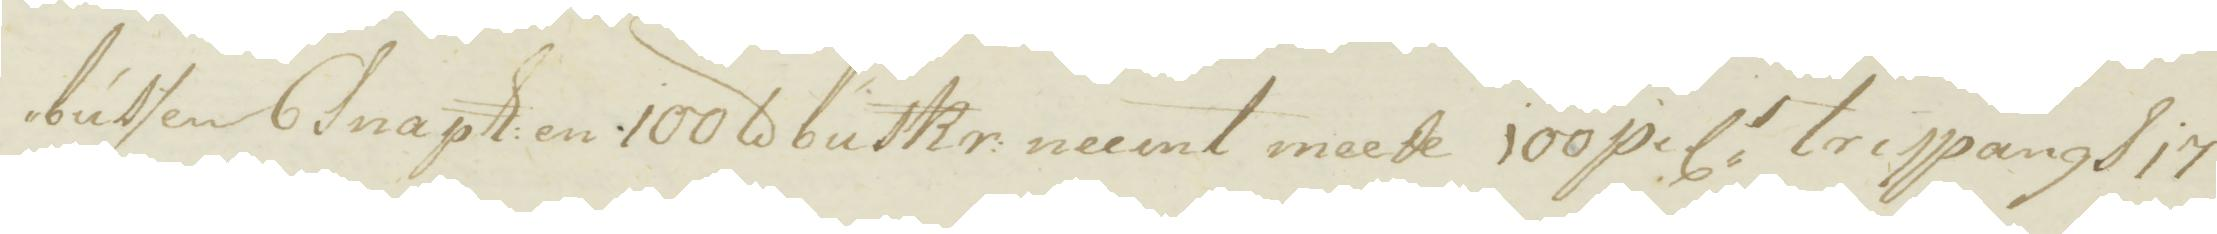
„bussen 6 snaph: en 100 lb buskr: neemt meede 100 piC„s trippangs 17
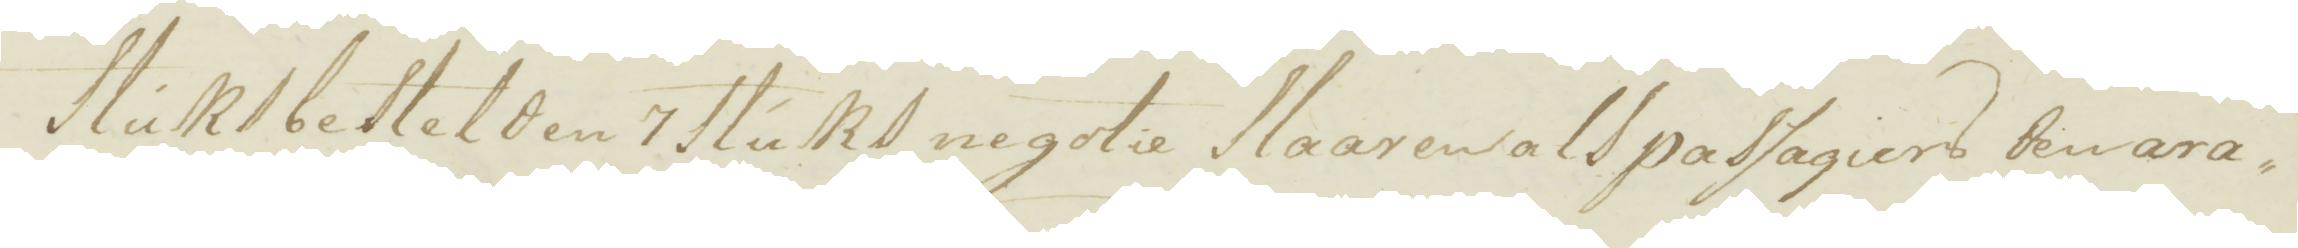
stuks bestelden 7 stuks negotie slaaven als passagiers den ara„
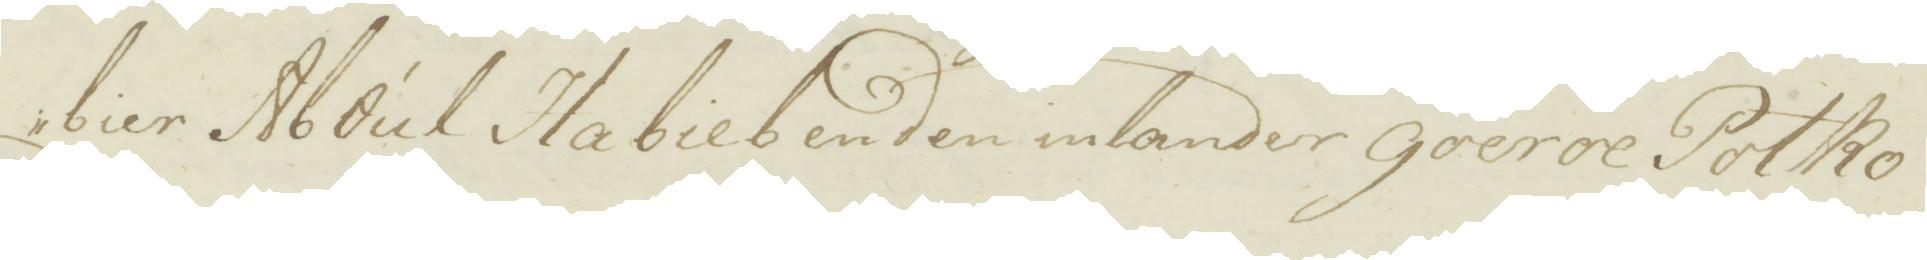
„bier Abdul Habieb en den inlander goeroe Potko
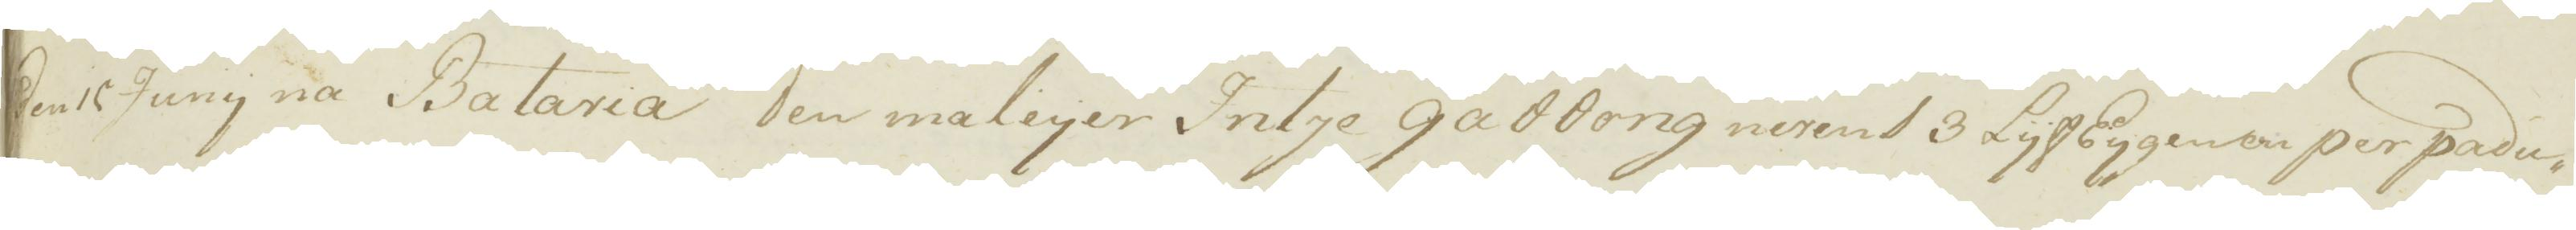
den 15 Junij na Batavia den maleijer Intje gaddong nevens 3 Lijf Eijgenen per padu„
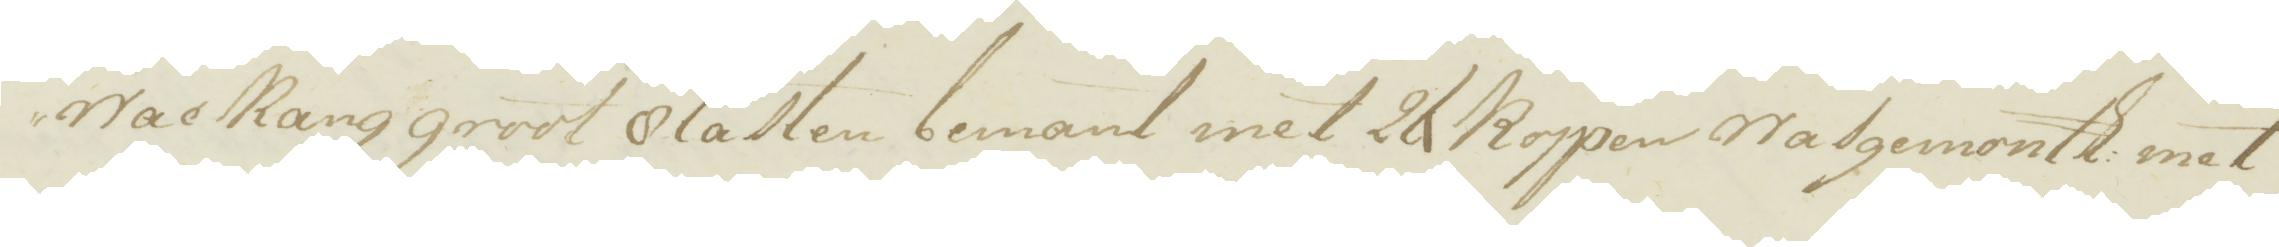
„wac Rang groot 8 lasten bemant met 24 koppen was gemonth: met
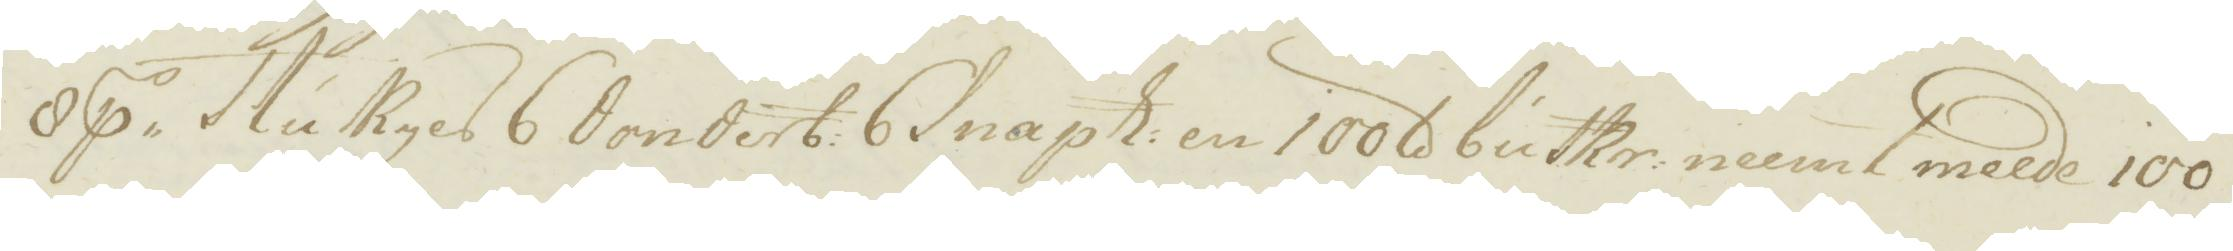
8 p„s stukjes 6 donderb: 6 snaph: en 100lb buskr: neemt meede 100
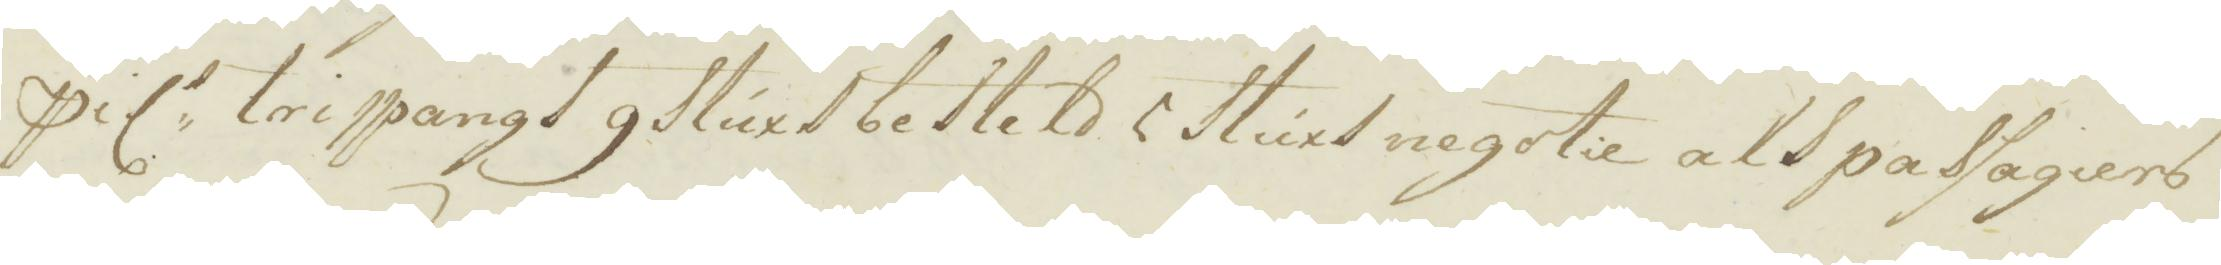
piC„s trippangs 9 stuks besteld 5 stuxs negotie als passagiers
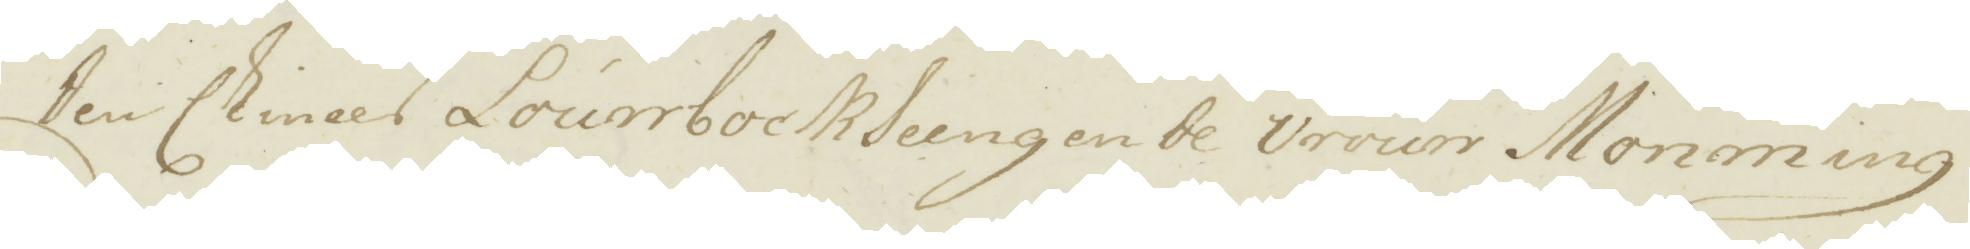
den Chinees Louwboekseeng en de vrouw Monming
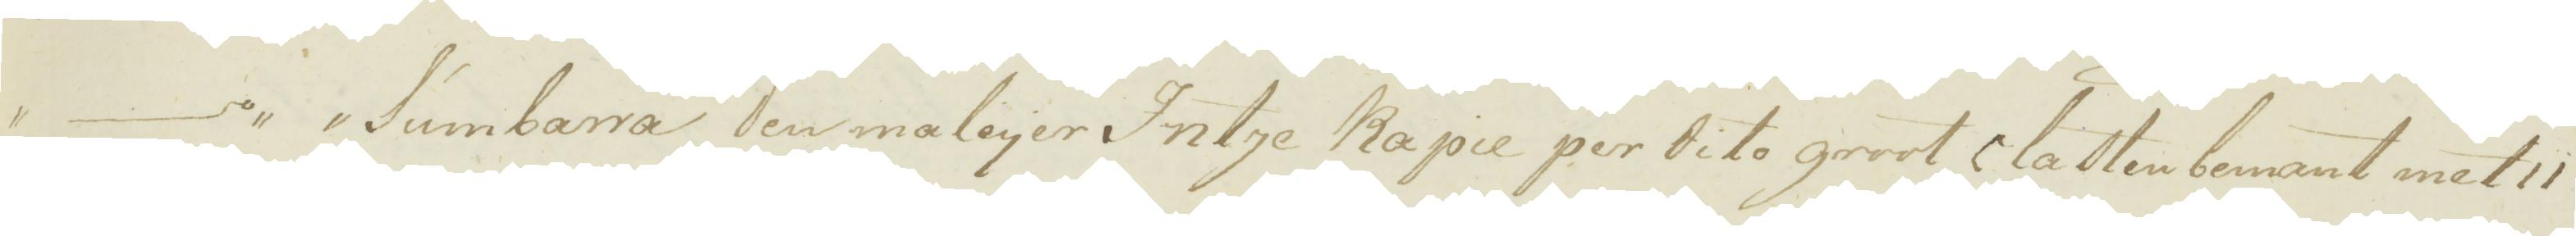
„ _o„ „ sumbawa den maleijer Intje kapie per dito groot 5 lasten bemant met 11
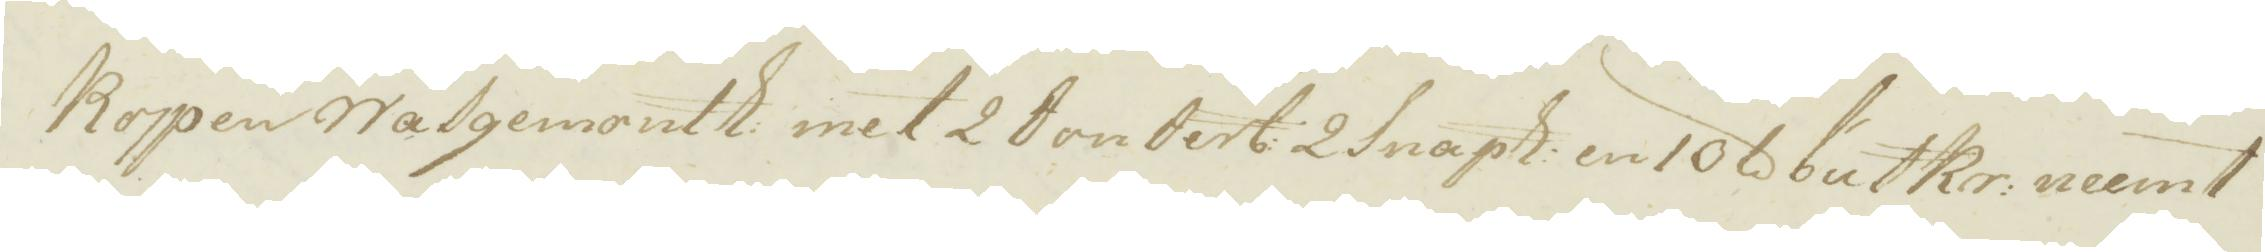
koppen was gemonth: met 2 donderb: 2 snaph: en 10 lb buskr: neemt
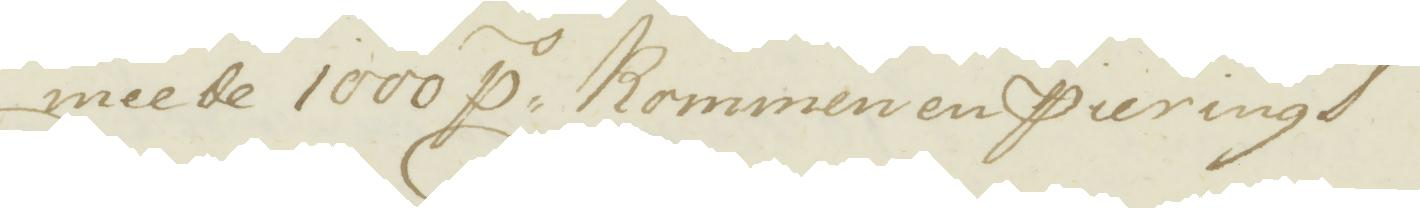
meede 1000 p„s kommen en pierings
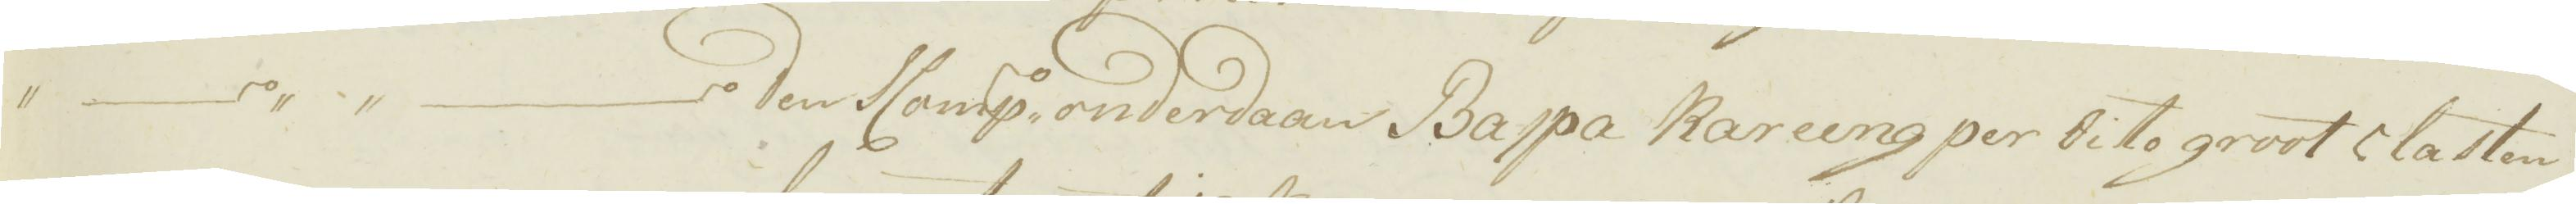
„ _o„ „ _o den sComp„s onderdaan Bappa kareeng per dito groot 5 lasten
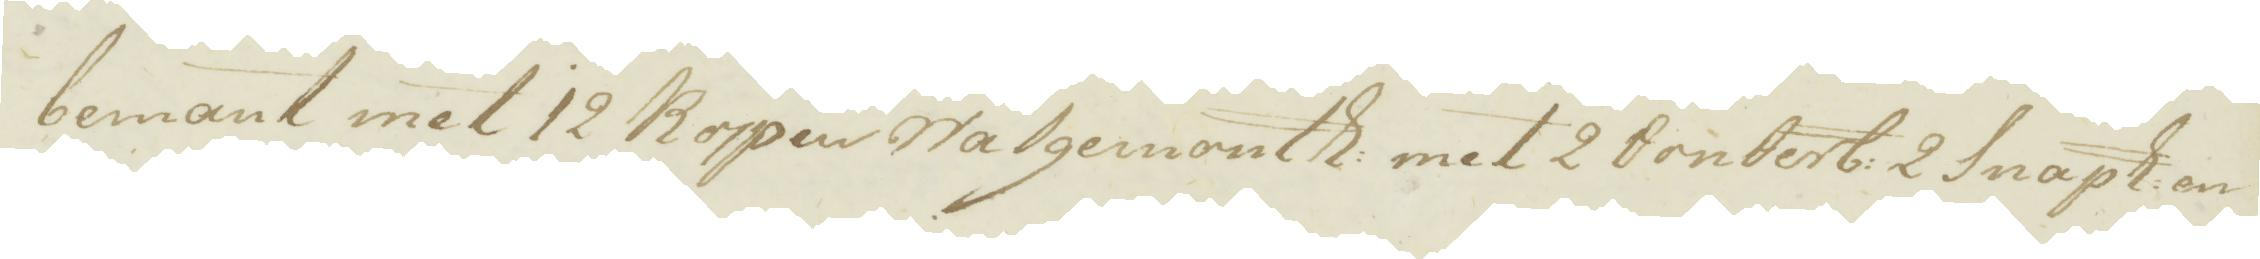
bemant met 12 koppen was gemonth: met 2 donderb: 2 snaph: en
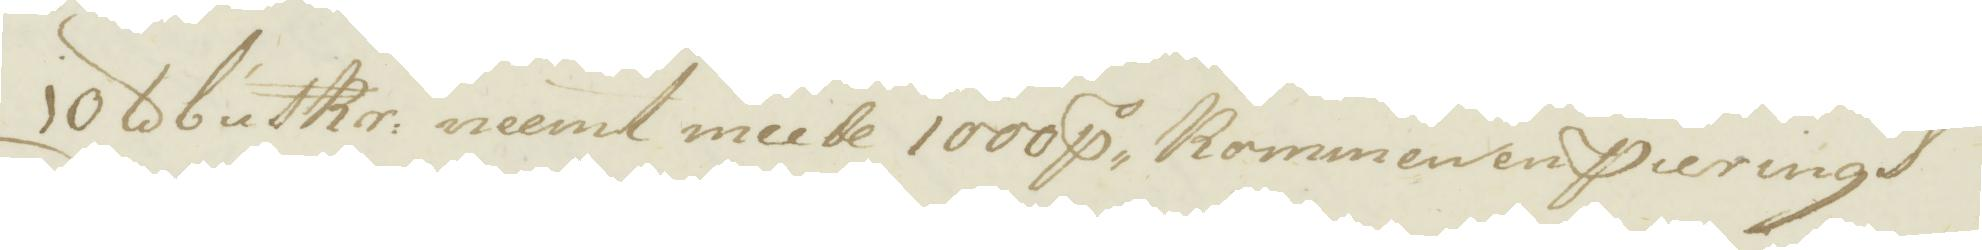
10 lb buskr: neemt meede 1000 p„s kommen en pierings
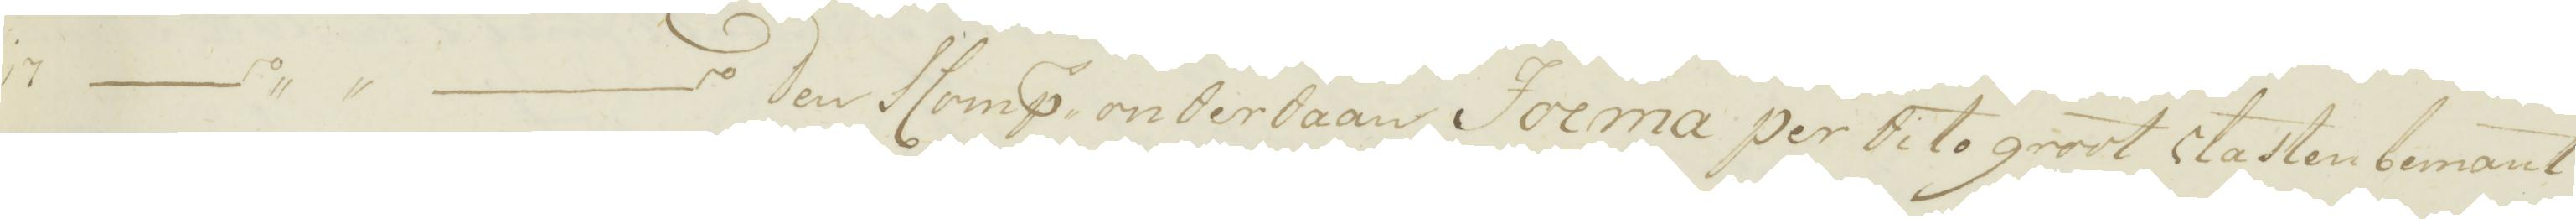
17 _o„ „ _o den sComp„s onderdaan Ioema per dito groot 5 lasten bemant
